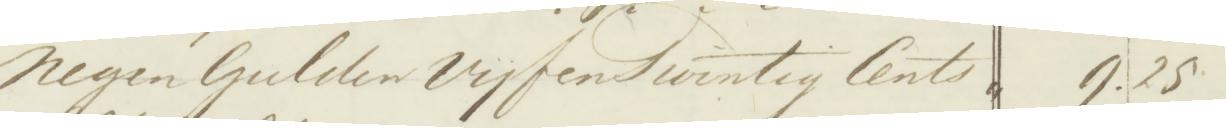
Negen Gulden Vijfen Twintig Cents „ 9.25
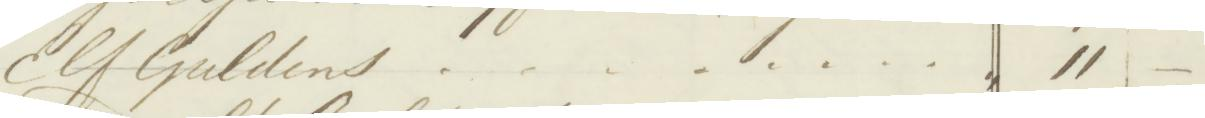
Elf Guldens . . . . . . . . „ 11 —
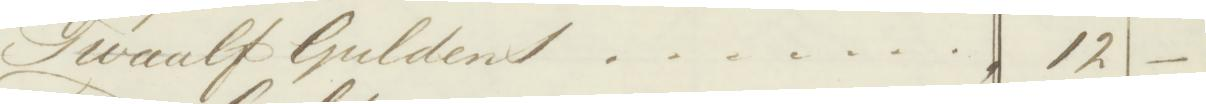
Twaalf Guldens . . . . . . . „ 12 —
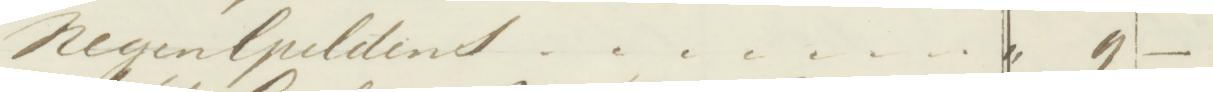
Negen Guldens . . . . . . . . „ 9 —
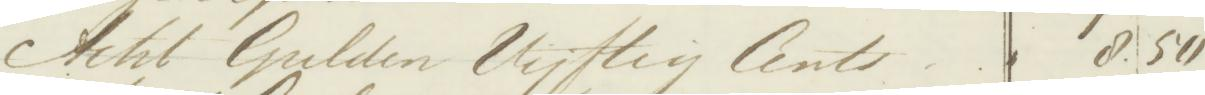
Acht Gulden Vijftig Cents . . „ 8.50
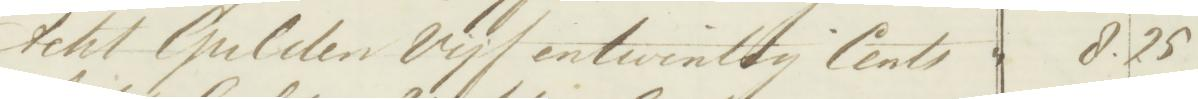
Acht Gulden Vijf entwintig Cents „ 8.25
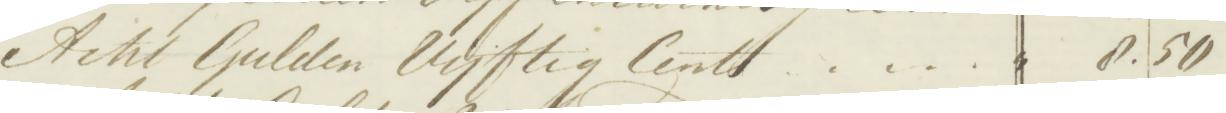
Acht Gulden Vijftig Cents . . . . . „ 8.50
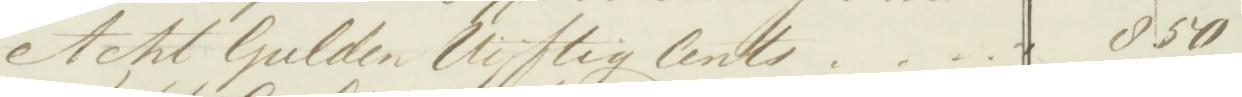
Acht Gulden Vijftig Cents . . . . „ 8.50
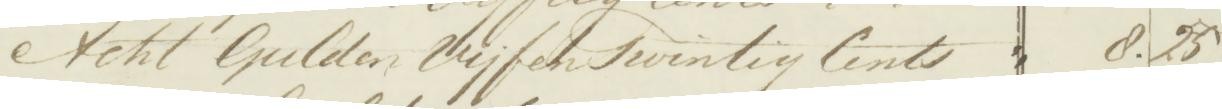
Acht Gulden Vijf en Twintig Cents „ 8.25
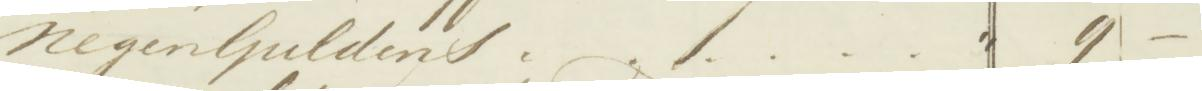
Negen Guldens . . . . . . . „ 9 —
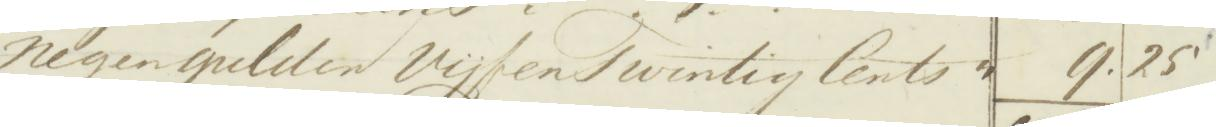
Negen gulden Vijfen Twintig Cents „ 9.25
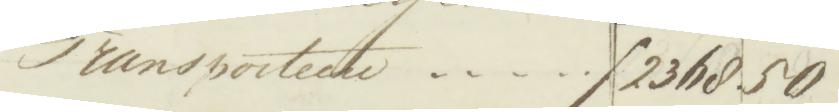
Transporteere . . . . . f 2368.50
